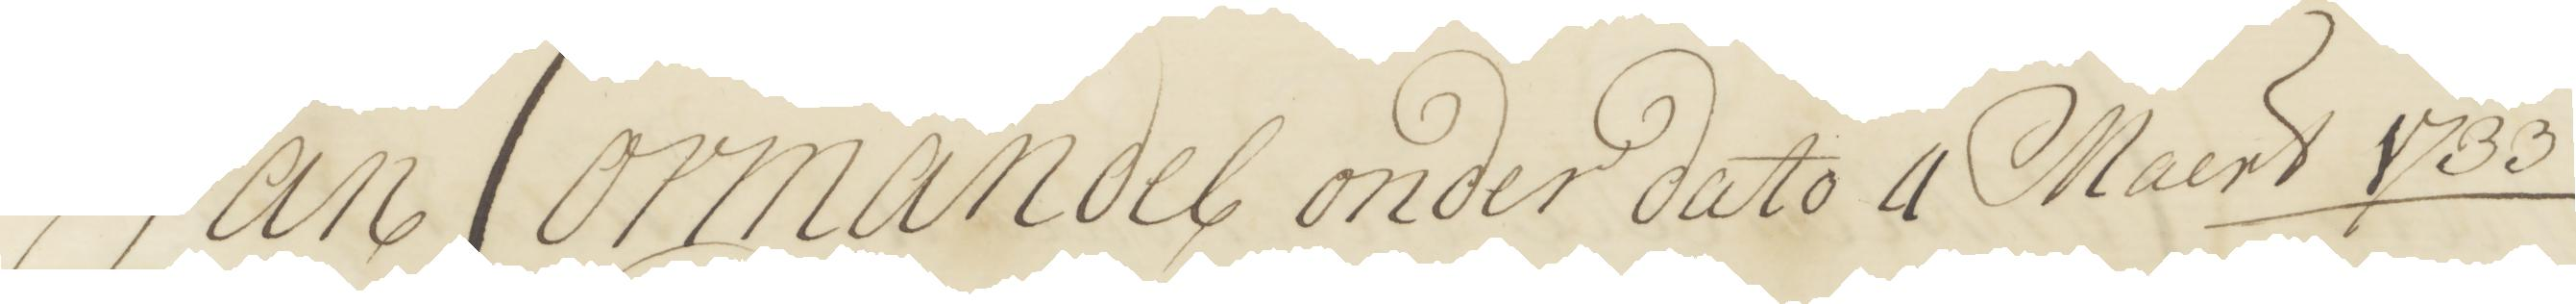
Van Cormandel onder dato 4 Maert 1733
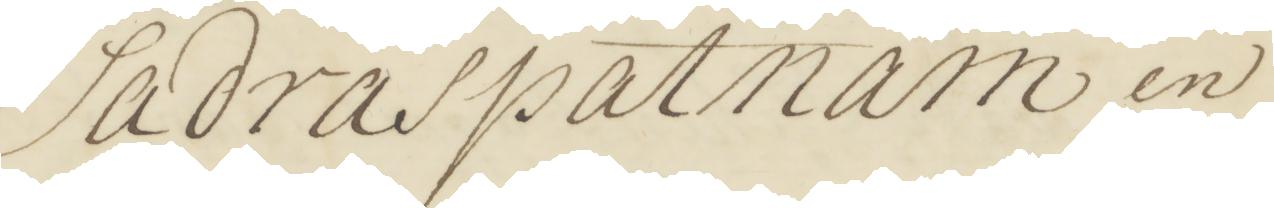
Sadraspatnam en
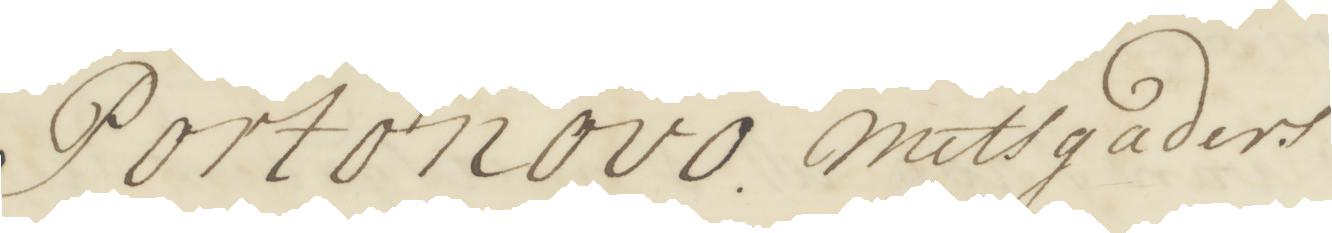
Portonovo mitsgaders
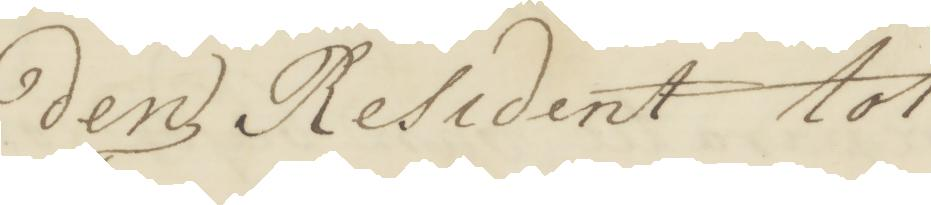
den Resident tot
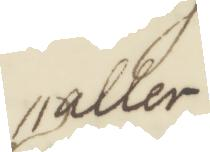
„aller
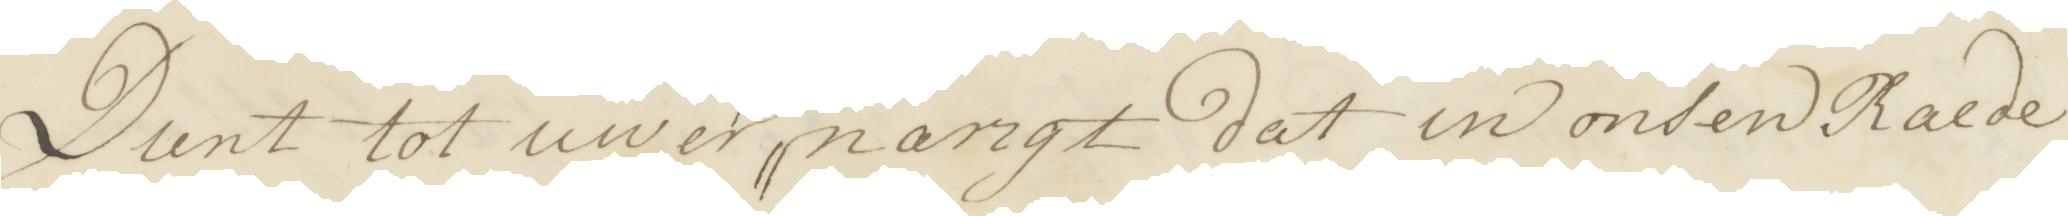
Dient tot uwer „narigt dat in onsen Raede
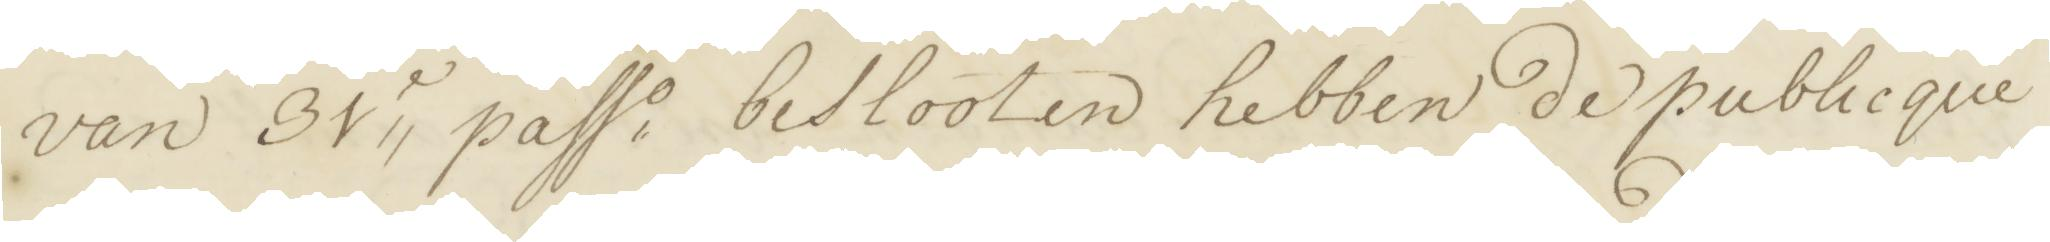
van 31„e pass„o beslooten hebben de publicque
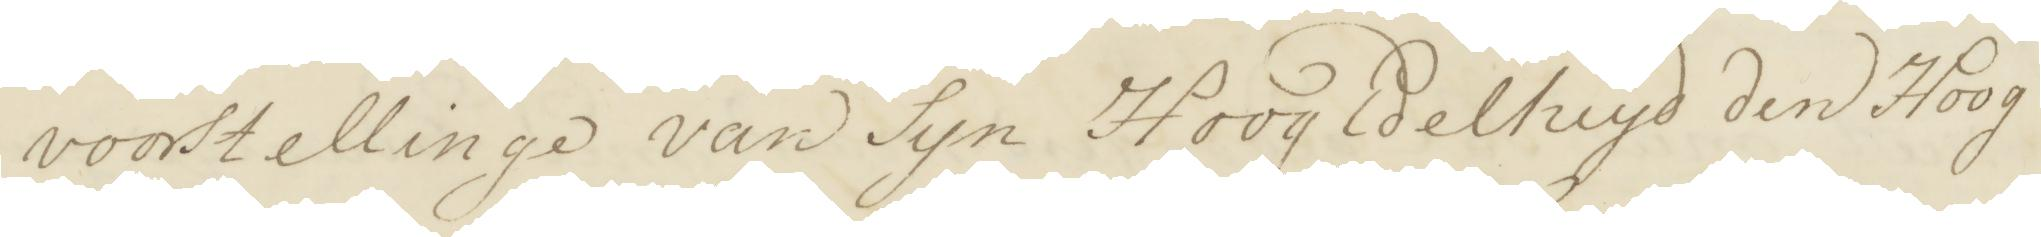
voorstellinge van syn Hoog Edelheyd den Hoog
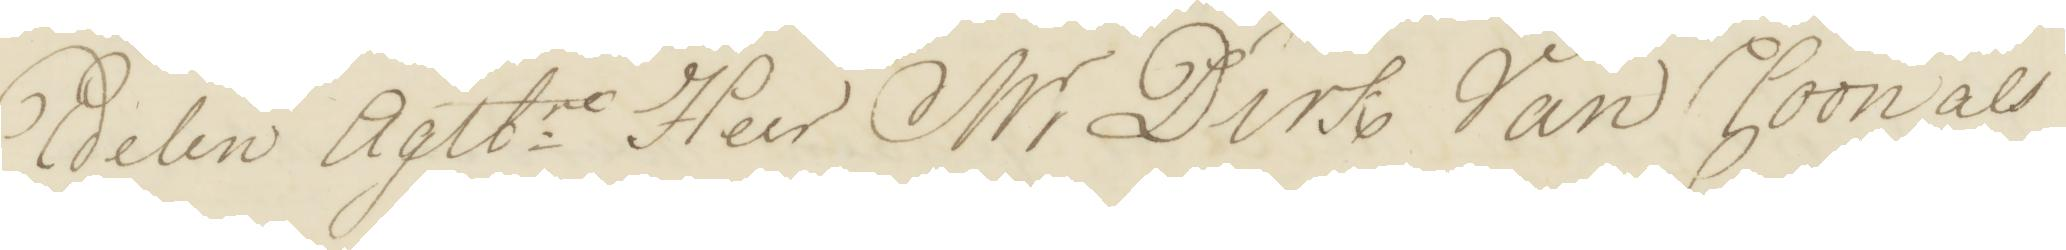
Edelen Agtb=re Her M„r Dirk Van Cloon als
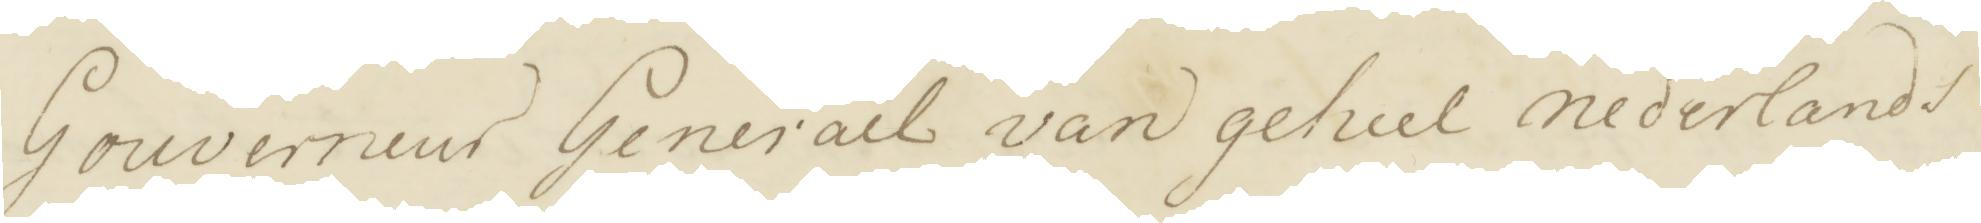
Gouverneur Generael van geheel nederlands
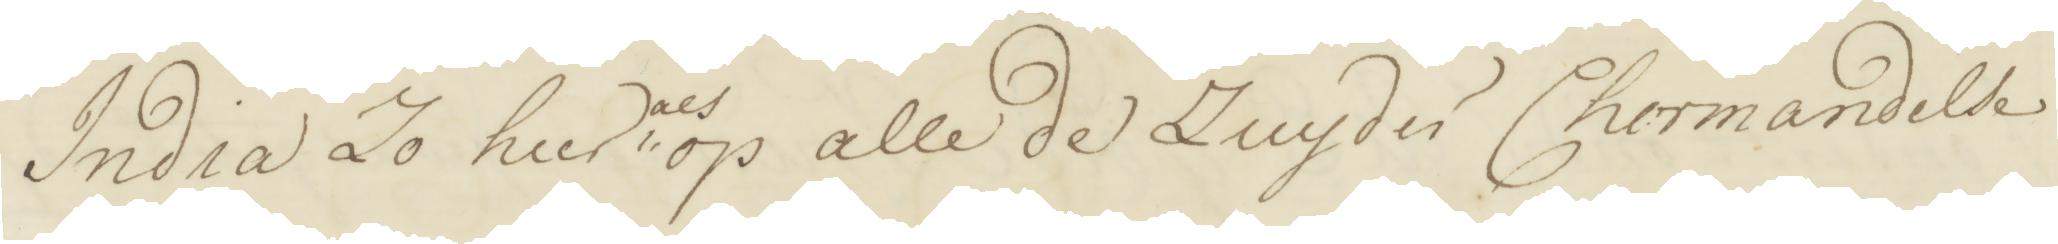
India zo hier „ op alle de Zuyder Chormandelse
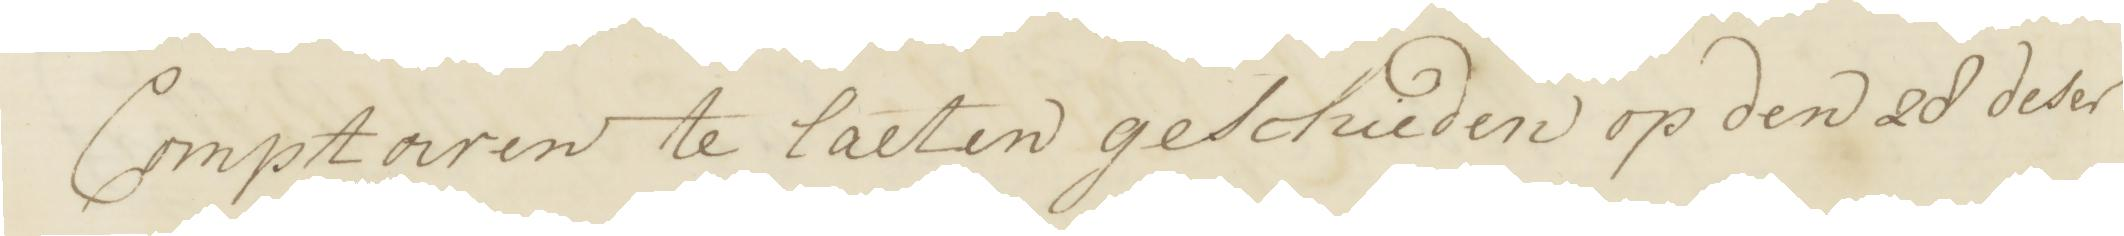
Comptoiren te laeten geschieden op den 28 deser
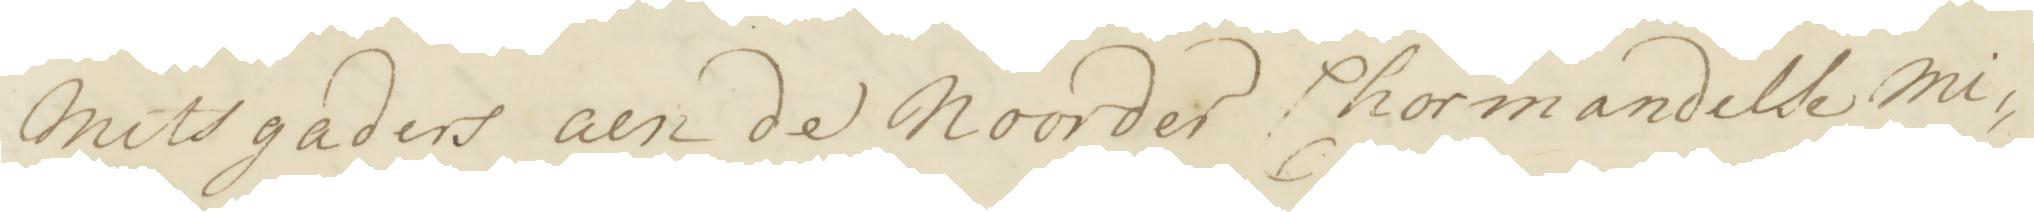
mitsgaders aen de noorder Chormandelse mi„
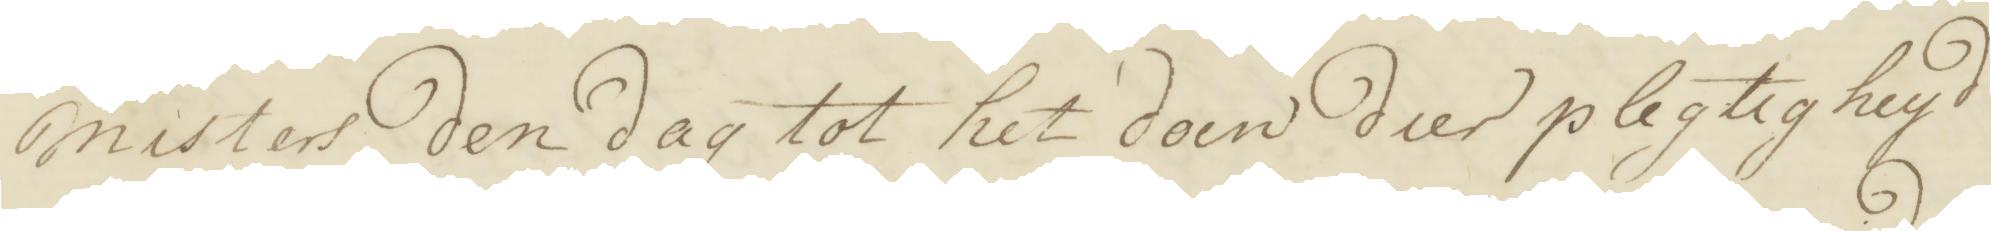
mister den dag tot het doen dier plegtigheyd
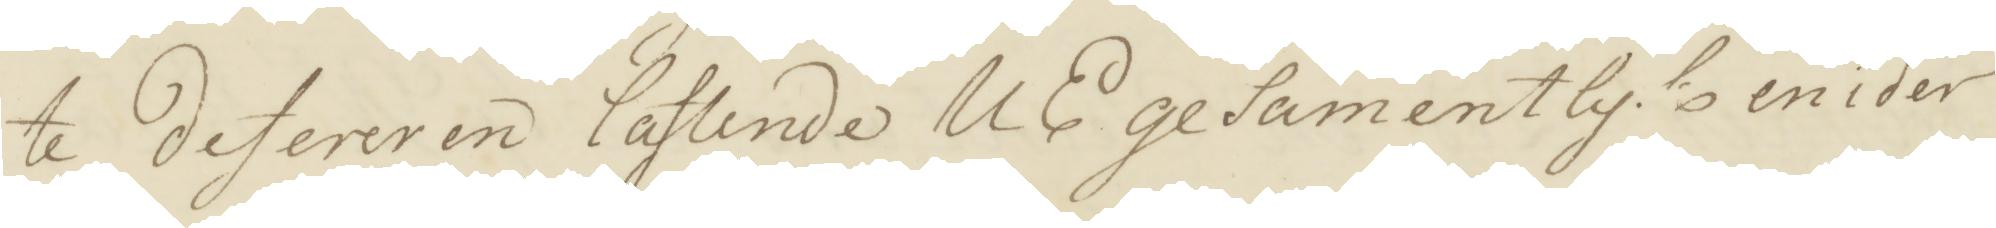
te defereren lastende UE gesamentlyk en ider
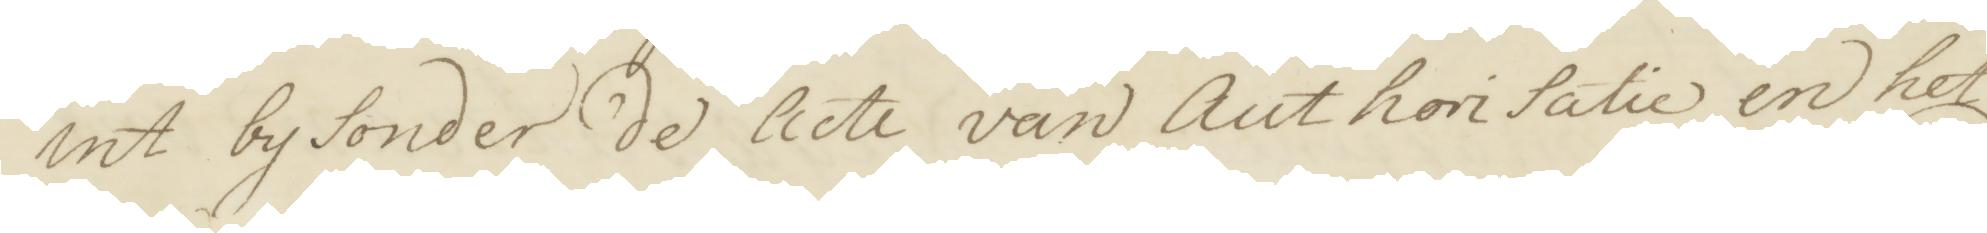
int by sonder de Acte van Authorisatie en het
